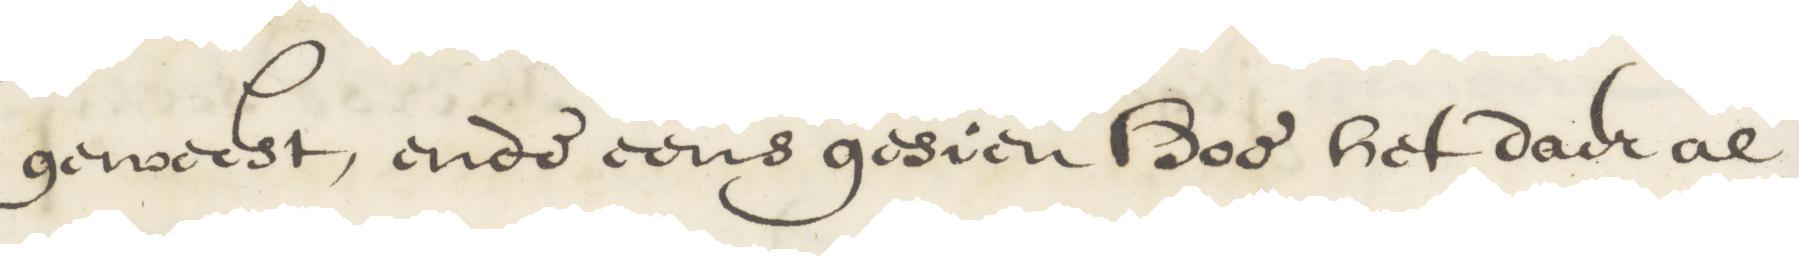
geweest, ende eens gesien hoe het daer al
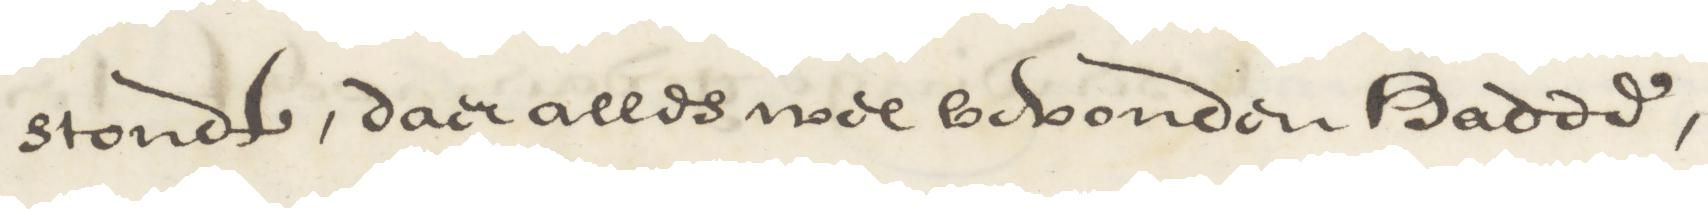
stondt, daer alles wel bevonden hadde,
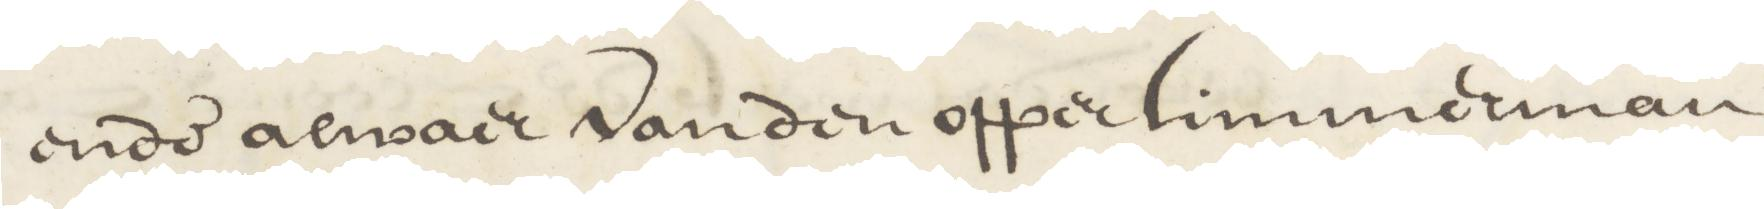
ende alwaer vanden oppertimmerman
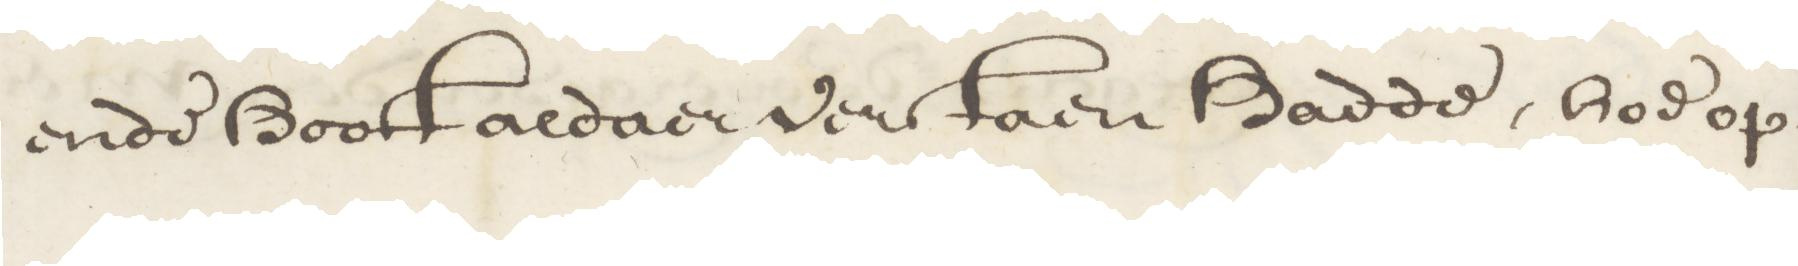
ende hooft aldaer verstaen hadde, hoe op
